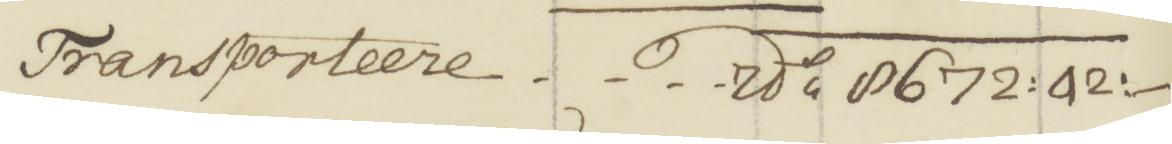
Transporteere . . . . . rd„s 8672: 42:—
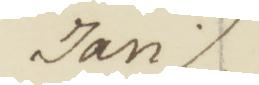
Jan %
